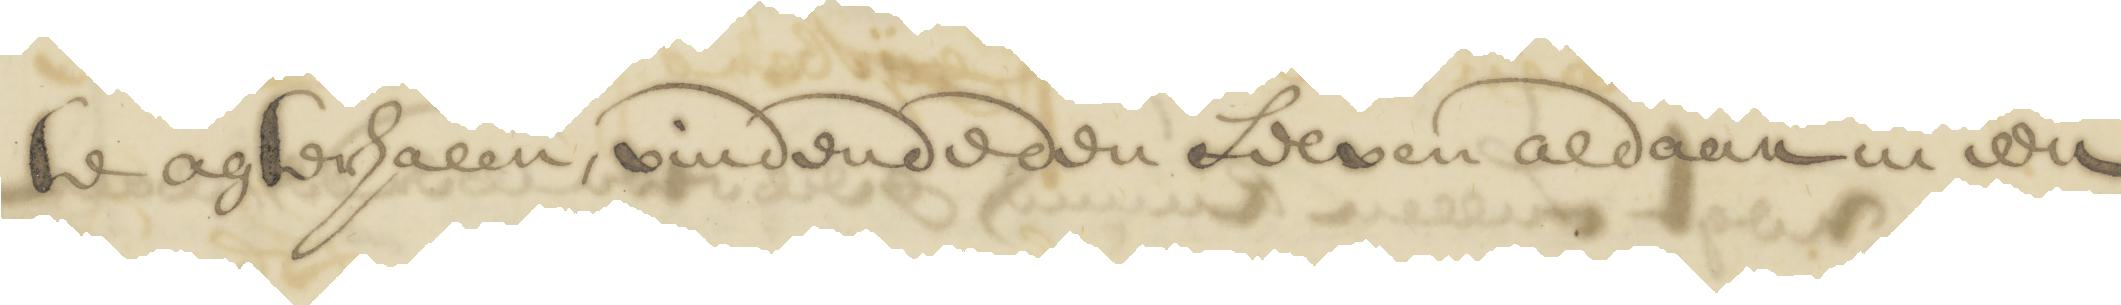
te agterhalen, vindende den selven aldaar in een
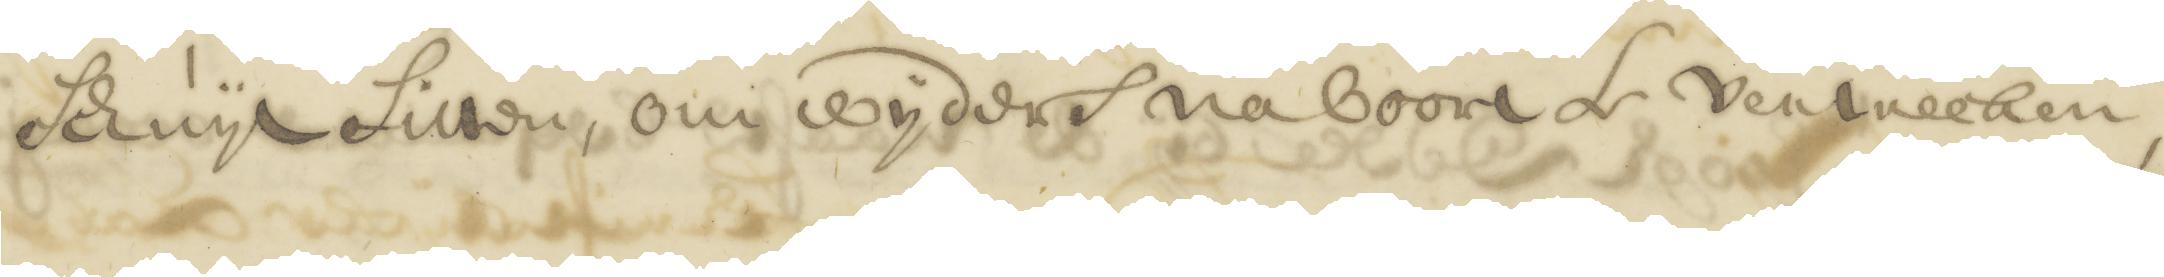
schuijt sitten, om wijders na boort te vertrecken,
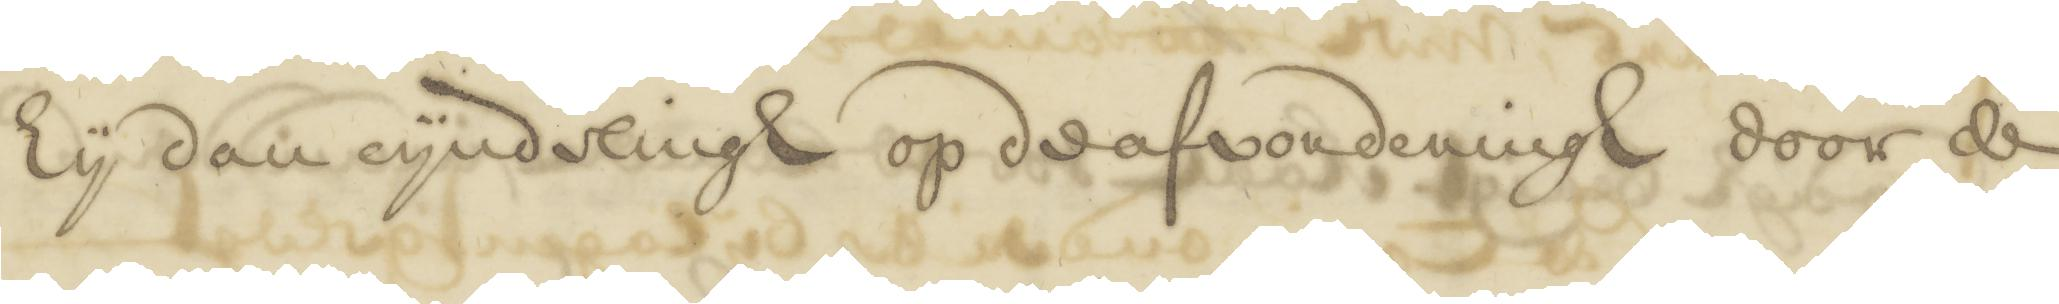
hij dan eijndelingh op de afvorderingh door de
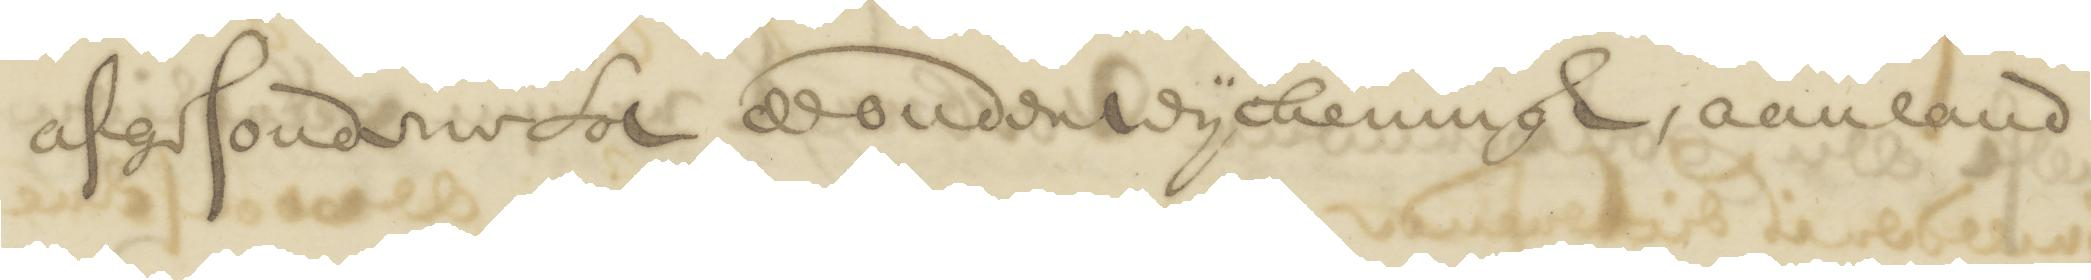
afgesondene tot de onderteijckeningh, aan land
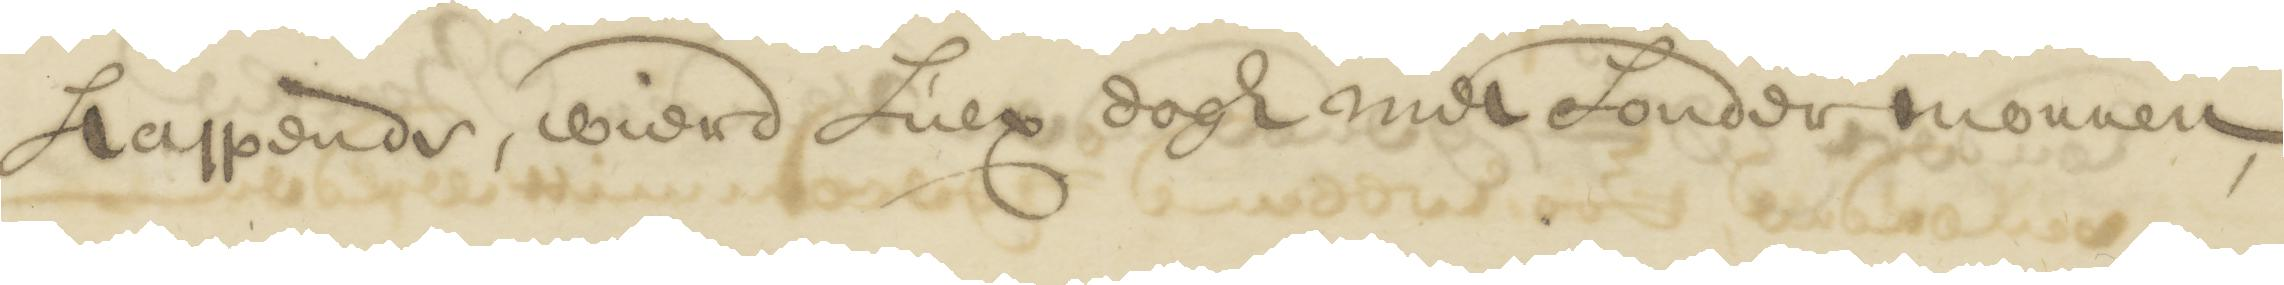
stappende, wierd sulx dogh niet sonder morren,
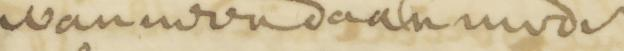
wanneer daar mede
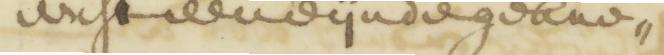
eerst een eijnde gekre„
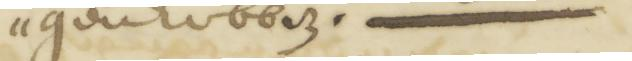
„gen hebben.—
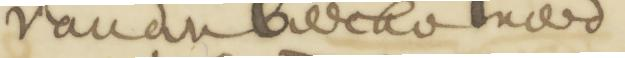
van der beecke treed
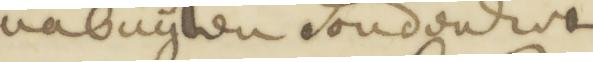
na buijten sonder het
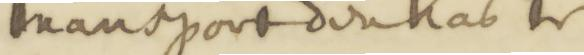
transport der kas te
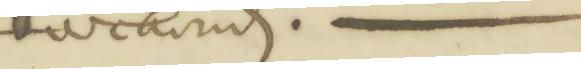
teeckenen.—
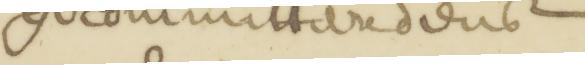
gecommitteerdens
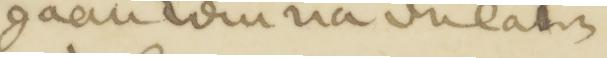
gaan hem na en laten
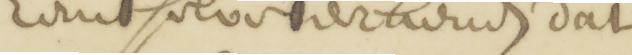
hem 't selve teckenen dat
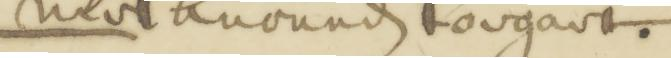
met knorren toegaet.
